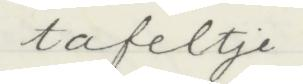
tafeltje
